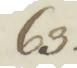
63.
